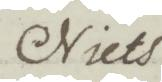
Niets
